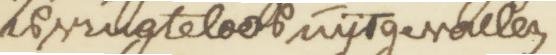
is vrugteloos uijtgevallen
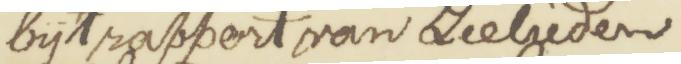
bij 't rapport van Zeelieden
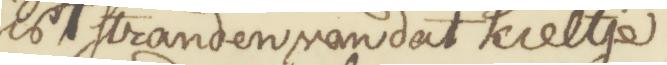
is 't Stranden, van dat kieltje
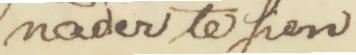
nader te sien
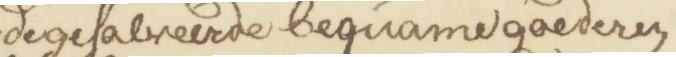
de gesalveerde bequame goederen
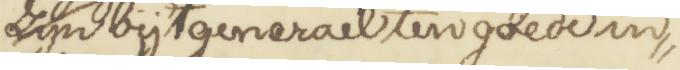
Zyn bij 't generael ten goede in„
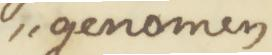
„genomen
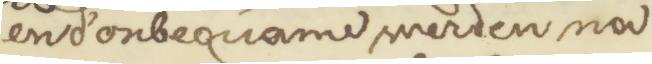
en d’onbequame werden na
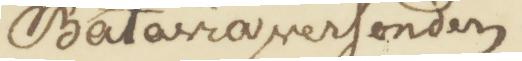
Batavia versonden
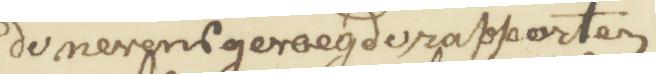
de nerens gevoegde rapporten
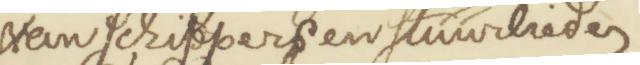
van Schippers en stuurlieden
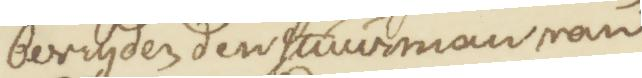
bevryden den Stuurman van
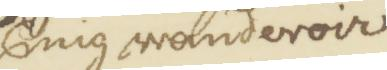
Enig wandevoir
